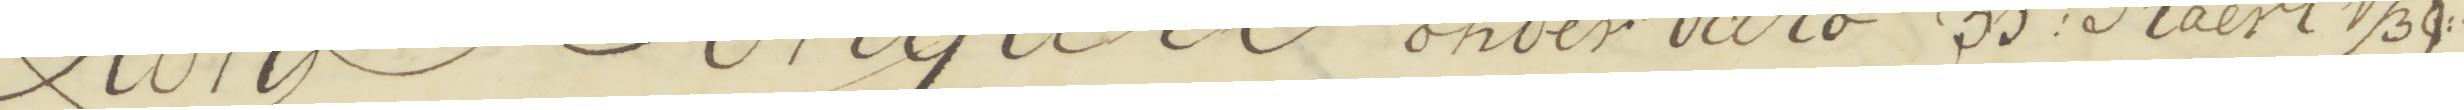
Van Bengale onder dato 31:' Maert 1739:
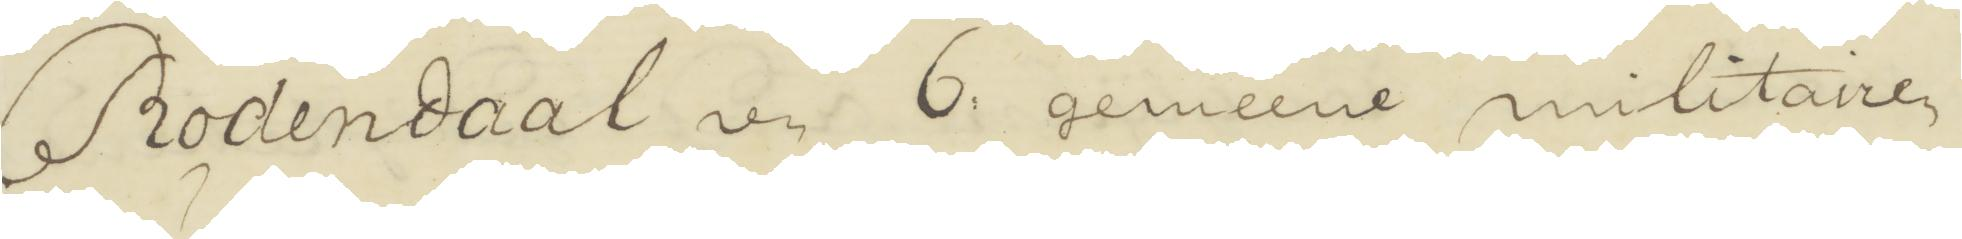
Rodendaal en 6: gemeene militairen
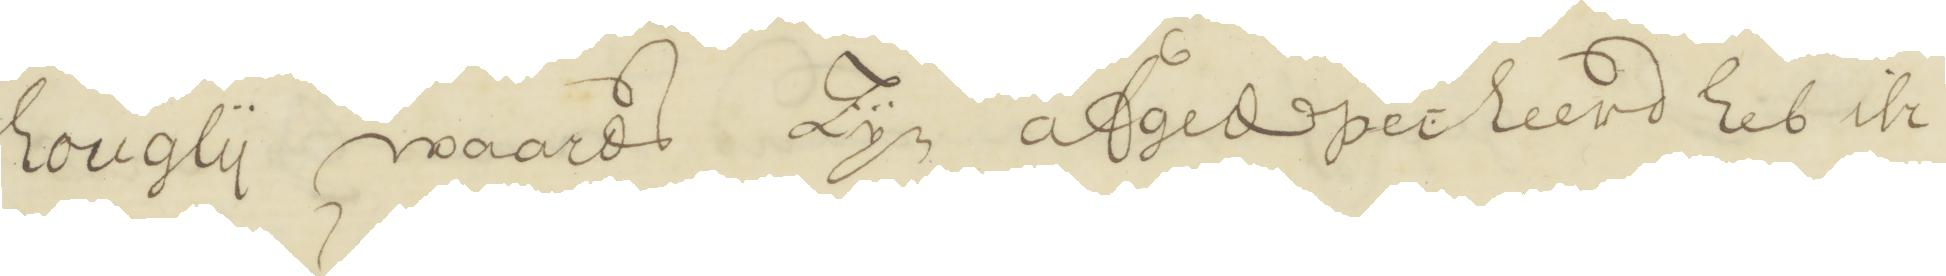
houglij waards zijn afgedepecheerd heb ik
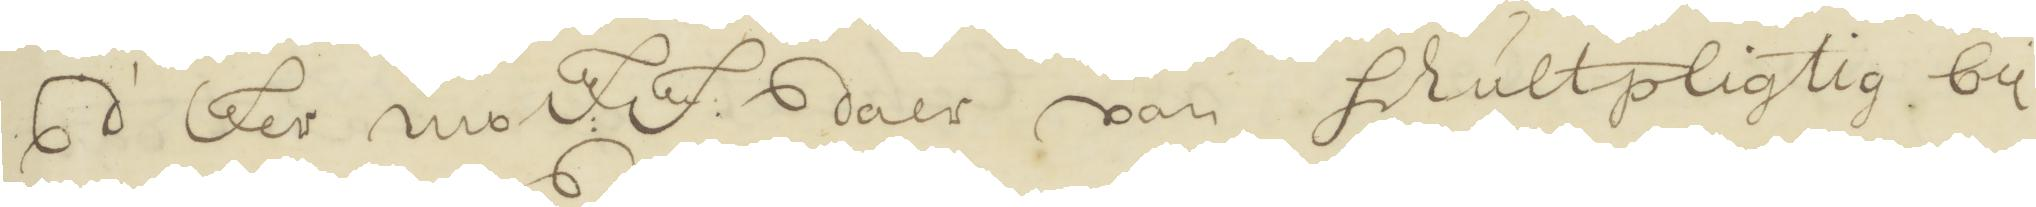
d' Eer uw E:E: daer van schultpligtig bij
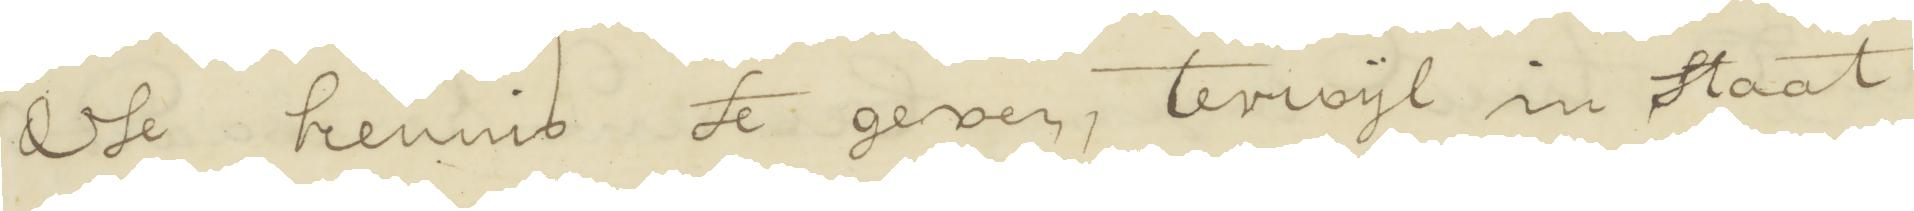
dese kennis te geven, terwijl in staat
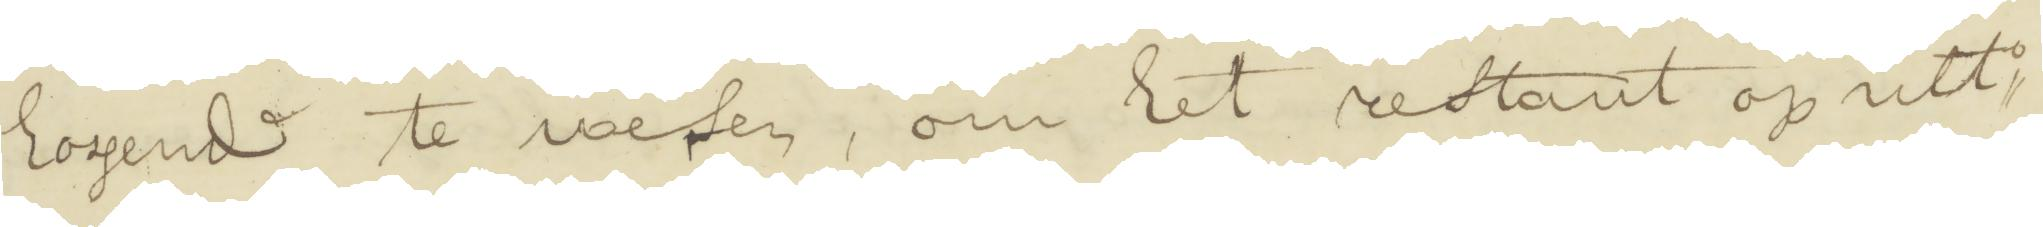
hopende te wesen, om het restant op ult„o
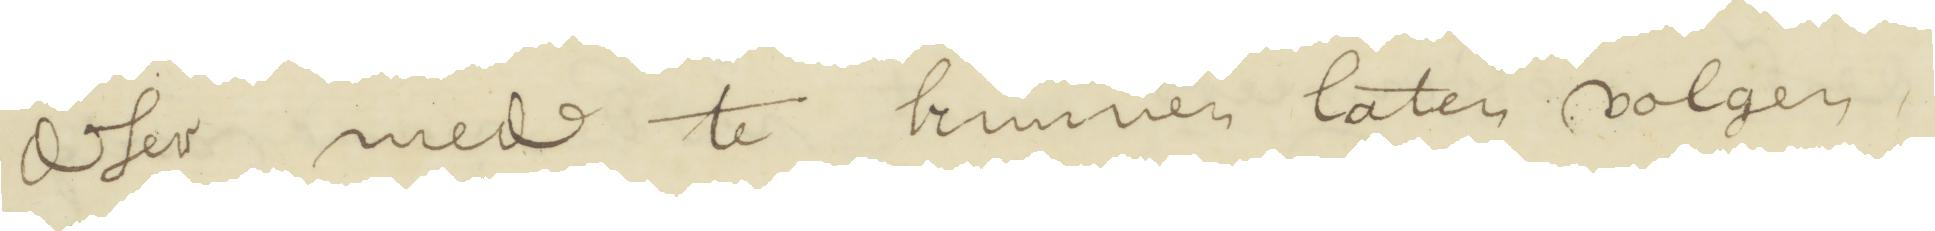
deser mede te kunnen laten volgen,
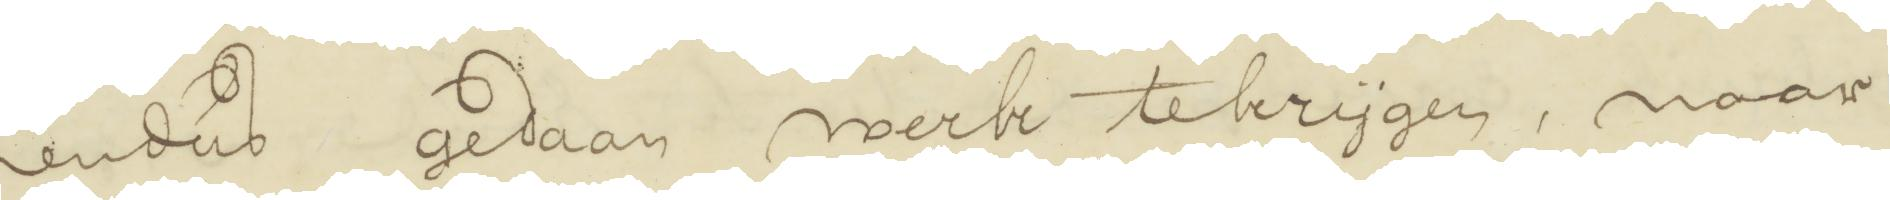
endus gedaan werk te krijgen, naar
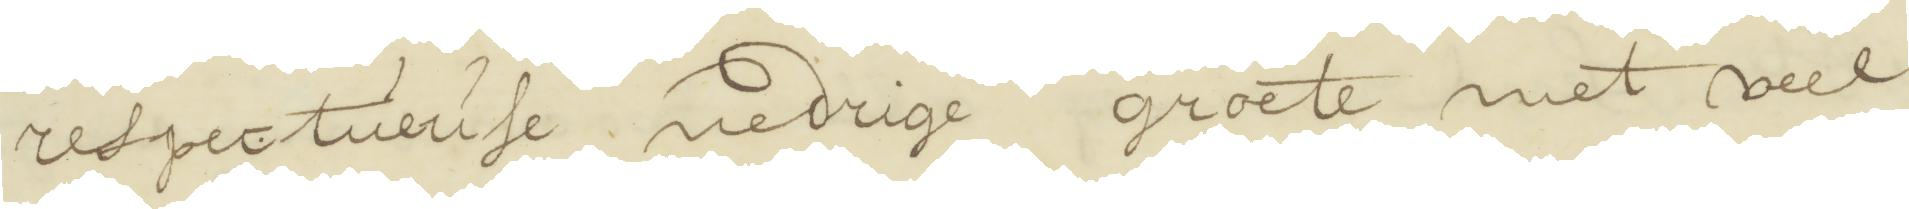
respectueuse nedrige groete met veel
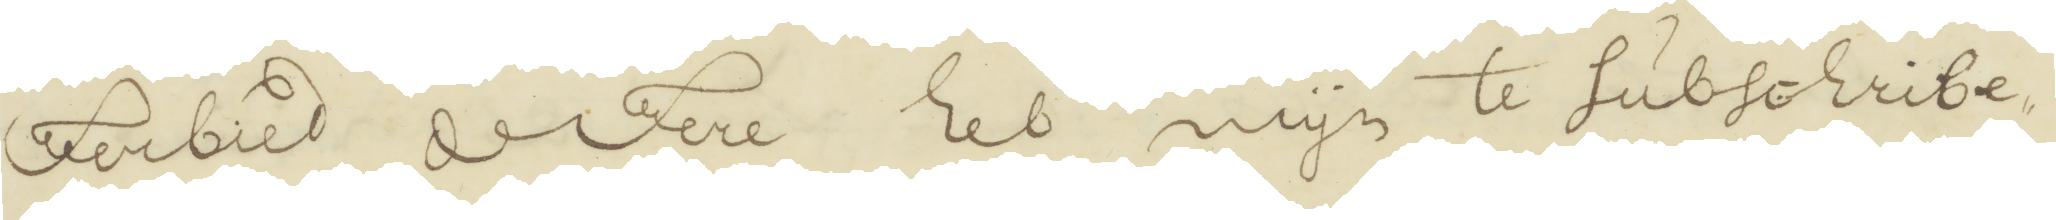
Eerbied de Eere heb mijn te subschribe„
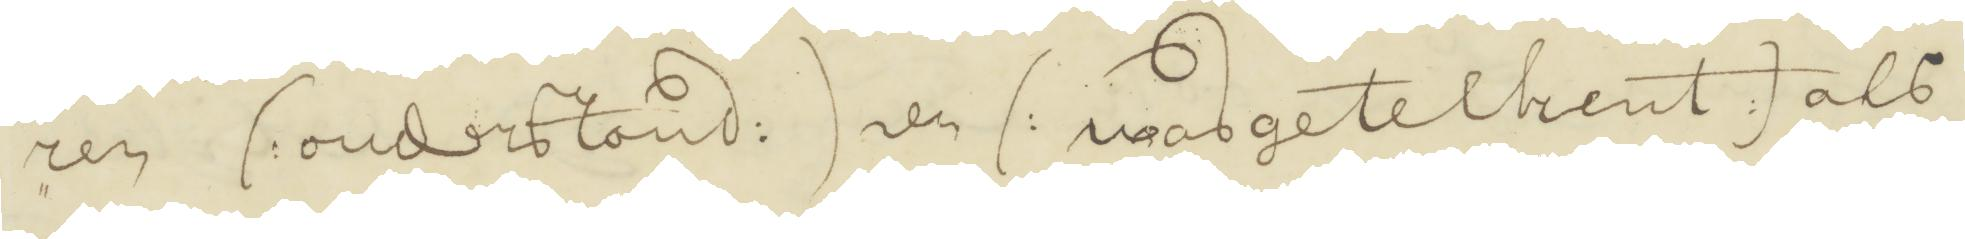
ren (:onderstond:) en (:was getelkent:/ als
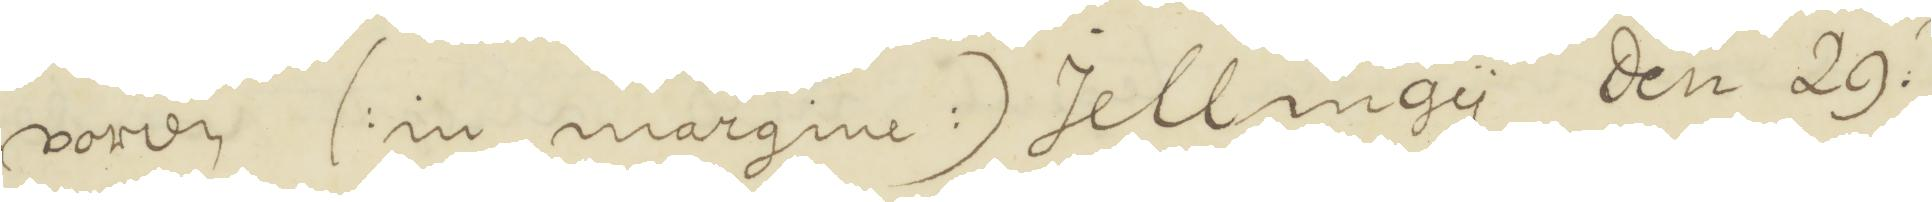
voren (:in margine:) Jellingij den 29:'
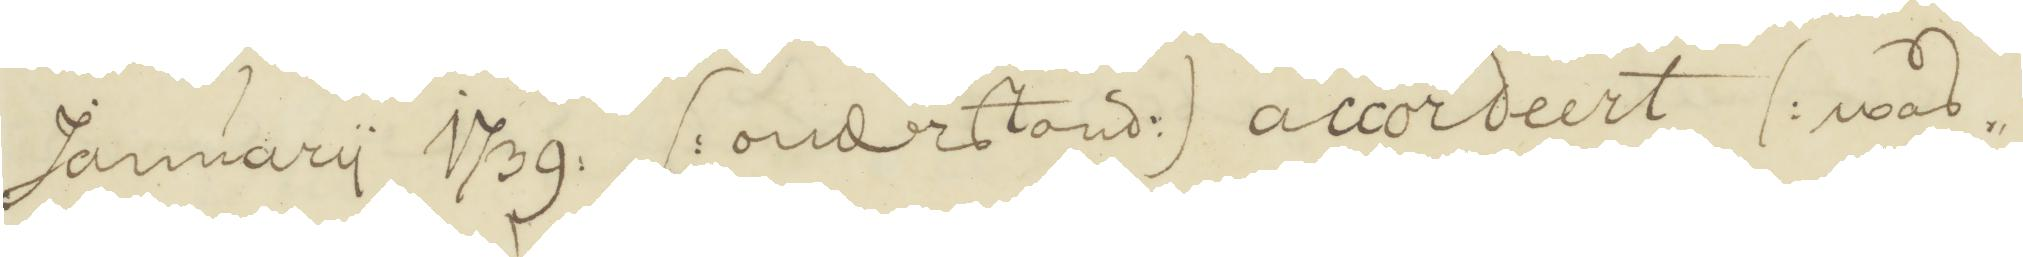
Januarij 1739. /:onderstond:) accordeert (:was„
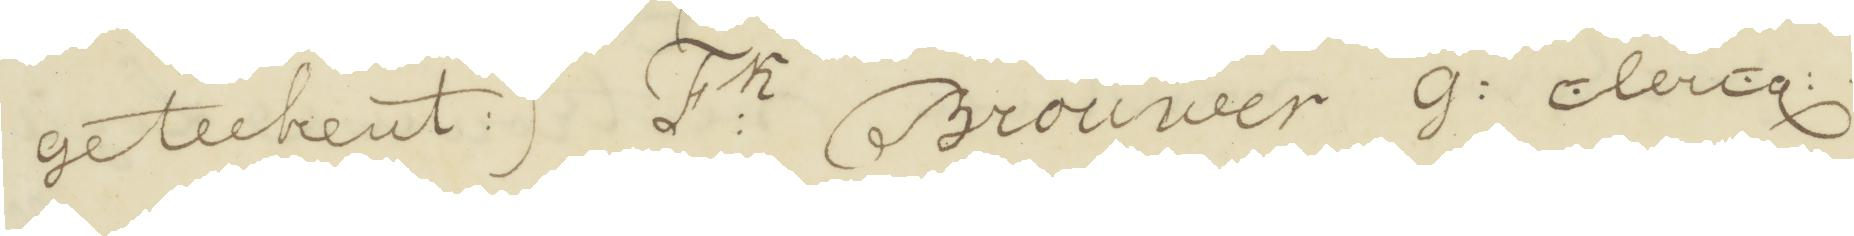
geteekent:) F:k Brouwer g: clercq:
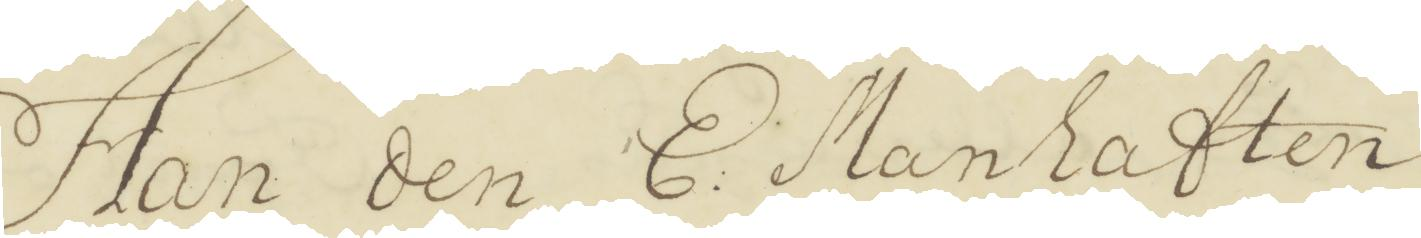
Aan den E: Manhaften
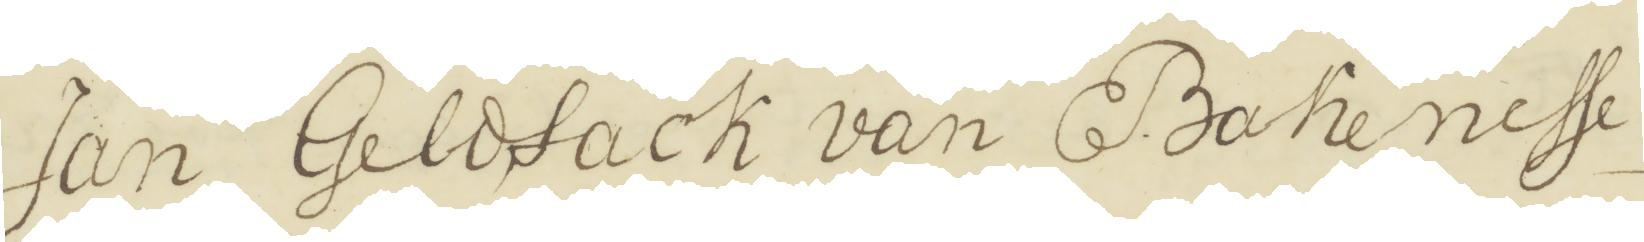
Jan Geldsack van Bakenesse
